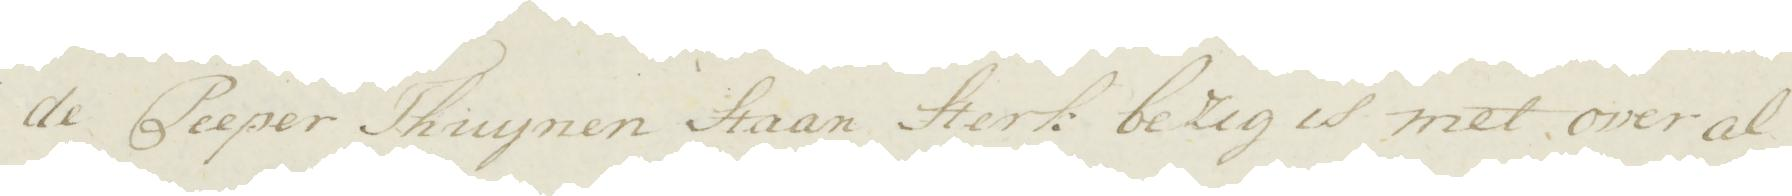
de Peeper Thuynen Staan Sterk bezig is met overal
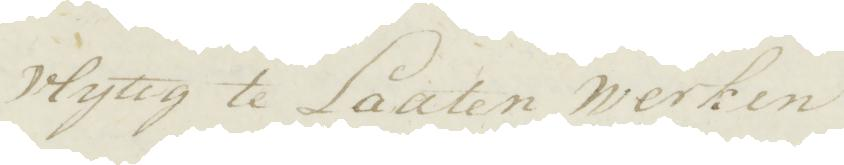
vlytig te Laaten werken
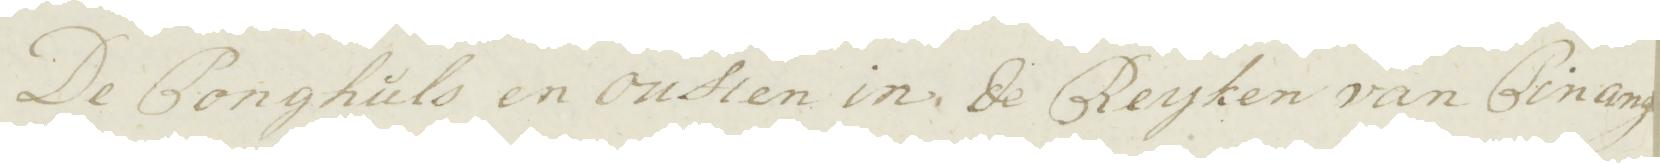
De Ponghulo en ousten in, de Reyken van Pinang
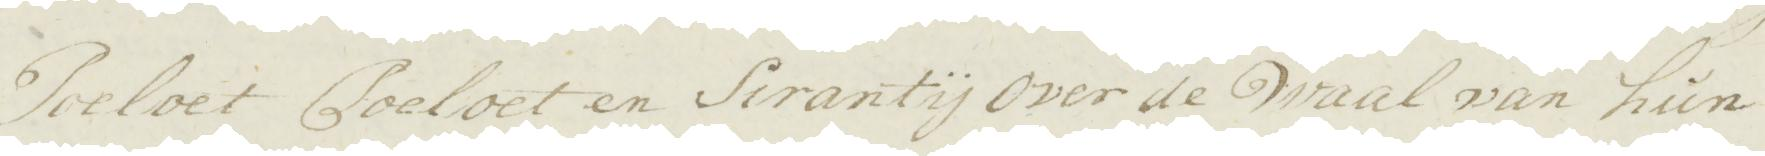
Poeloet Poeloet en Sirantij over de Waal van hun
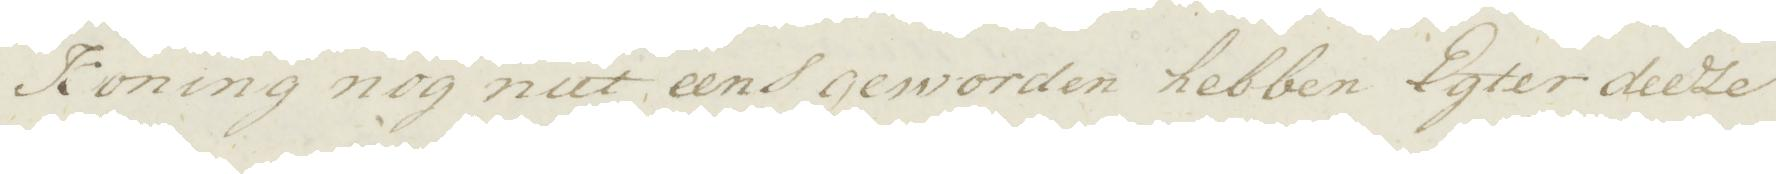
Koning nog niet, eens geworden hebben Egter deeze
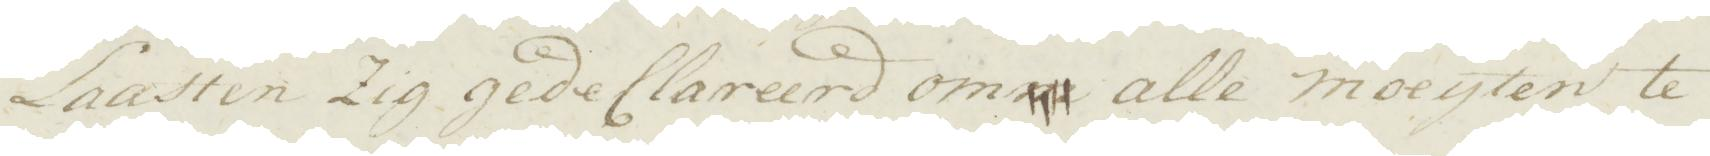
Laasten Zig gedeclareerd omm alle moeyten te
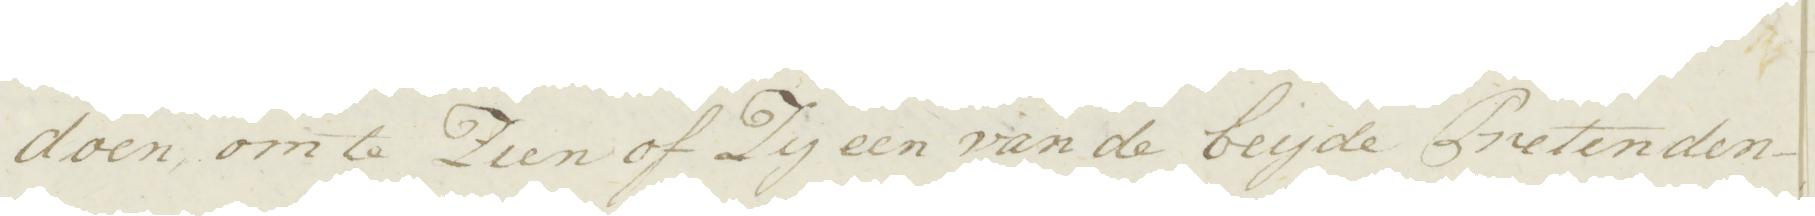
doen, om te Zien of Zy een van de beijde Pretenden=
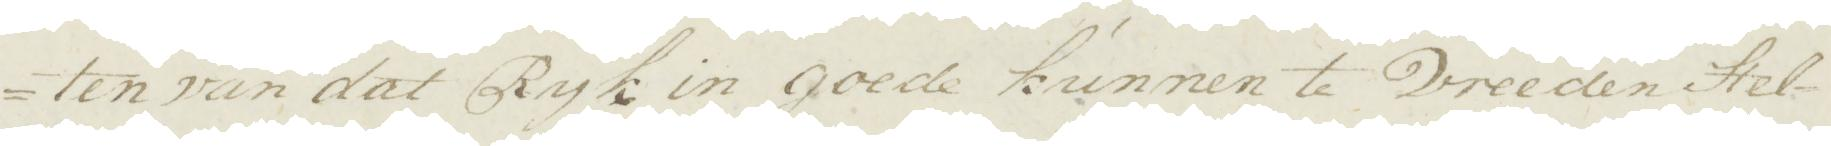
=ten van dat Ryk in goede kunnen te Vreeden Stel=
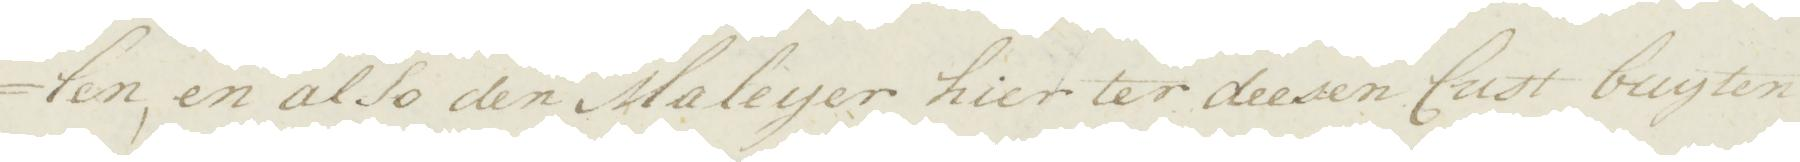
=len, en also den Maleyer hier ter deesen Cust buyten
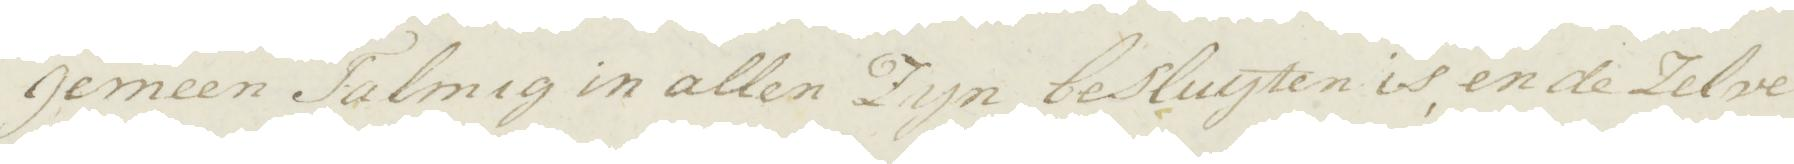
gemeen Talmig in allen Zyn besluyten is, en de Zelve
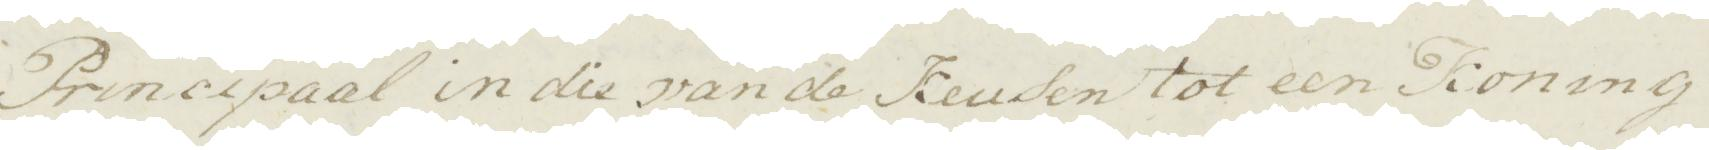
Principaal in die van de Keusen tot een Koning
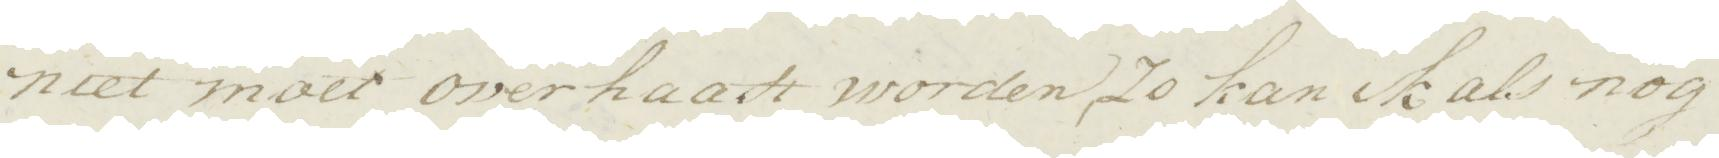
niet moet overhaast worden, Zo kan ik als nog
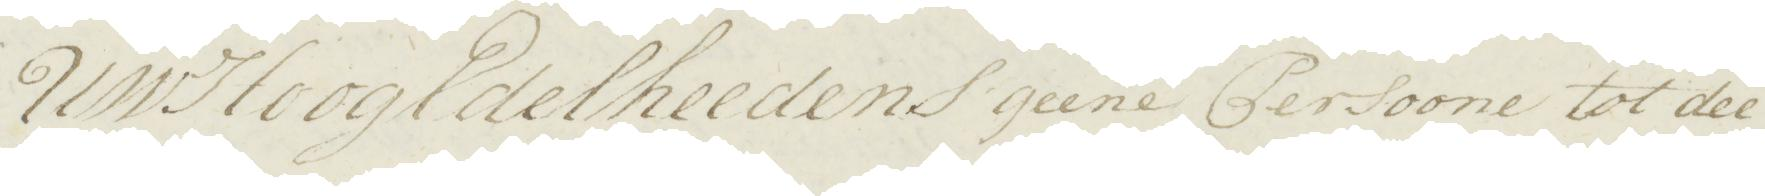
UW Hoog Edelheedens geene Persoone tot dee
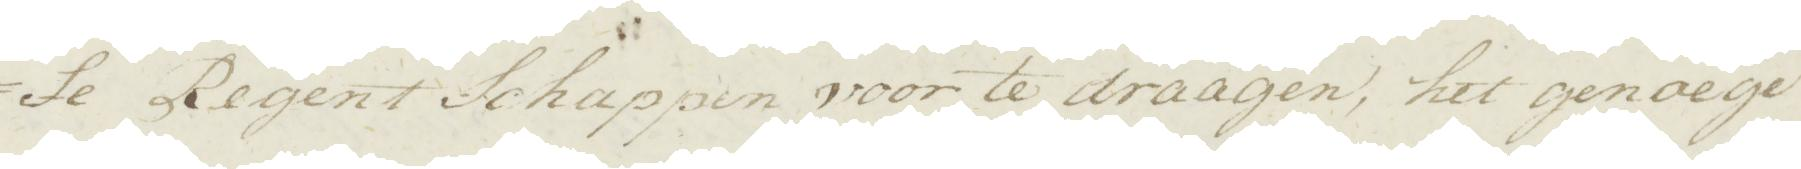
=se Regent schappen voor te draagen, het genoege
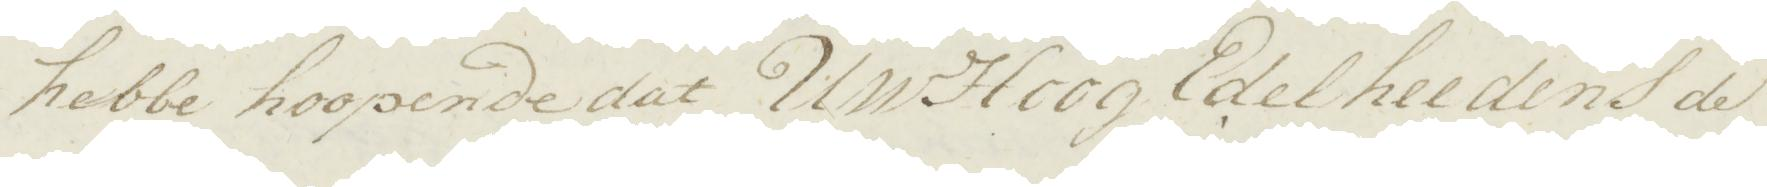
hebbe hoopende dat Uw Hoog Edelheedens de
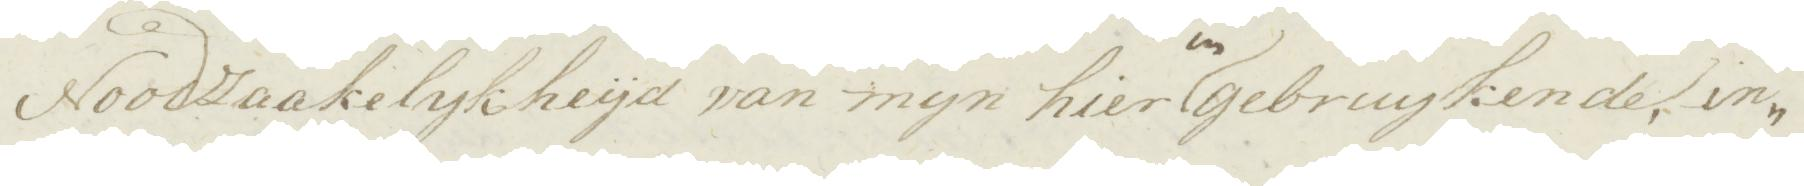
Noodzaakelykheijd van myn hier / gebruykende, in„
